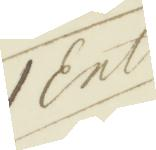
1 Entr
